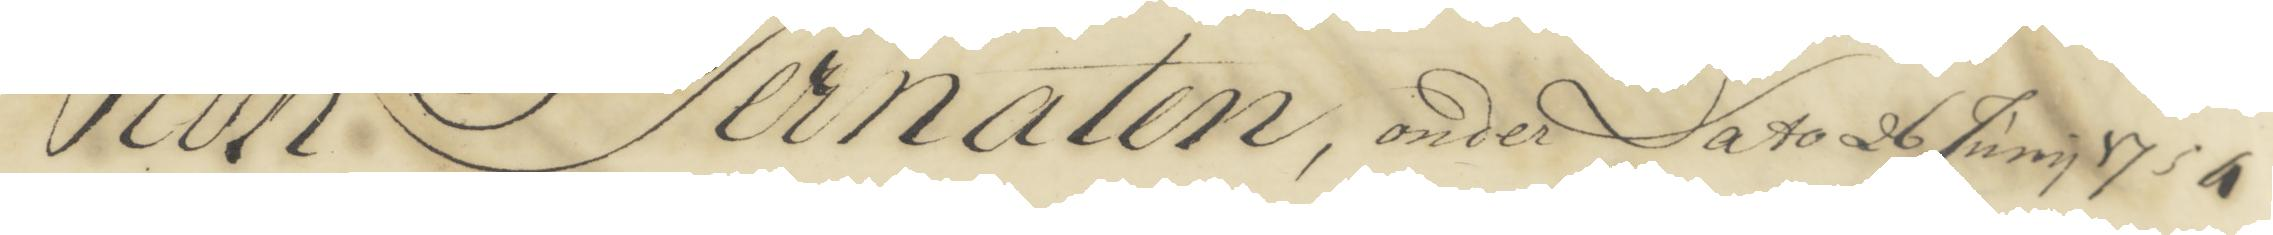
Van Ternaten, onder Dato 26 Junij 1754
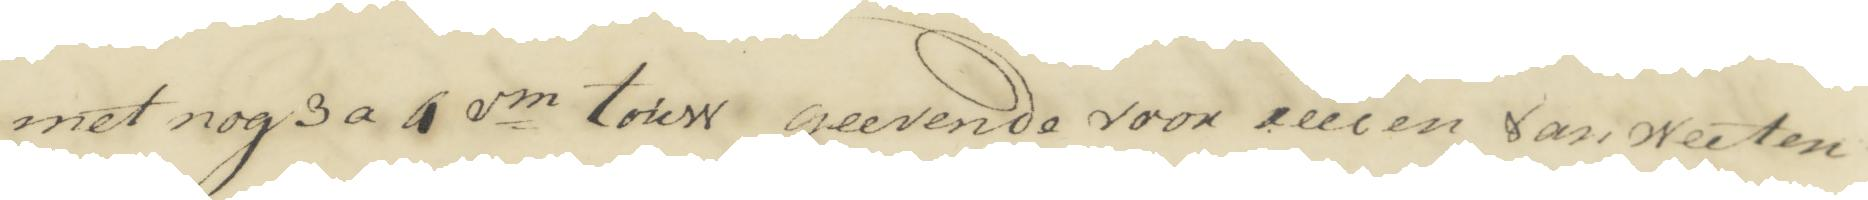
met nog 3 a 4 v=m touw geevende voor reeden van weeten
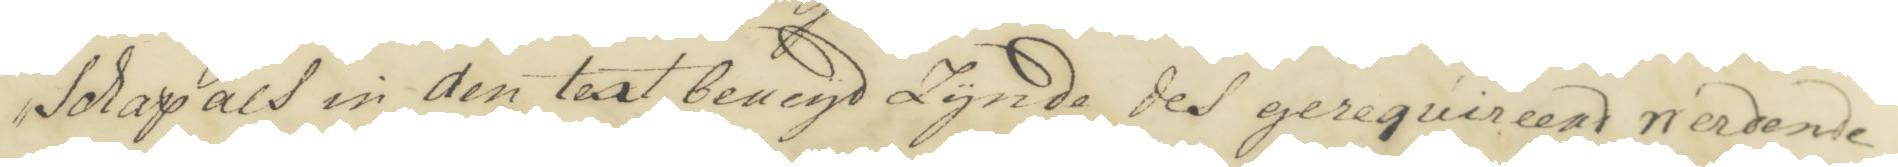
„schap als in den text bereijd zijnde des gerequireerd werdende
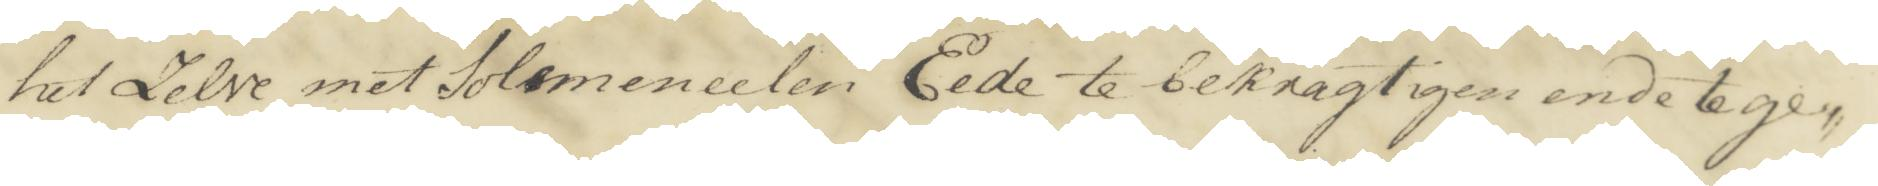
het zelve met solemeneelen Eede te bekragtigen ende te ge„
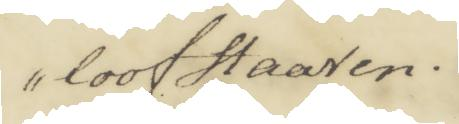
„loofstaaven.
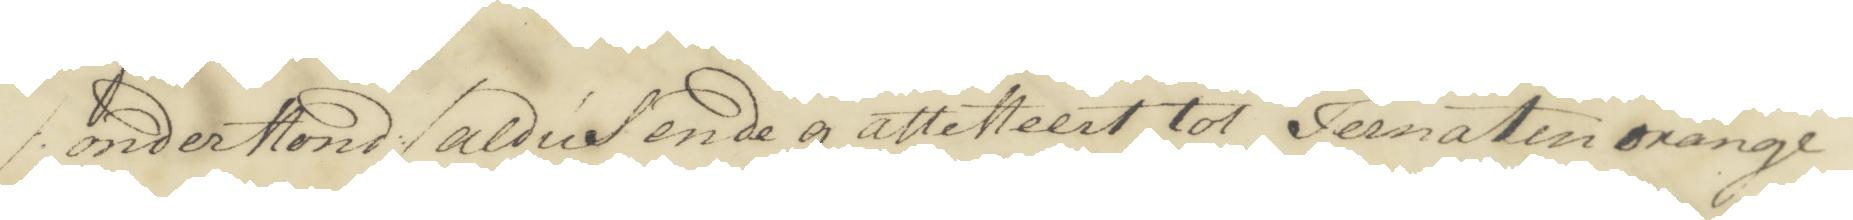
/:onderstond:/ aldus ende g attesteert tot Ternaten orange
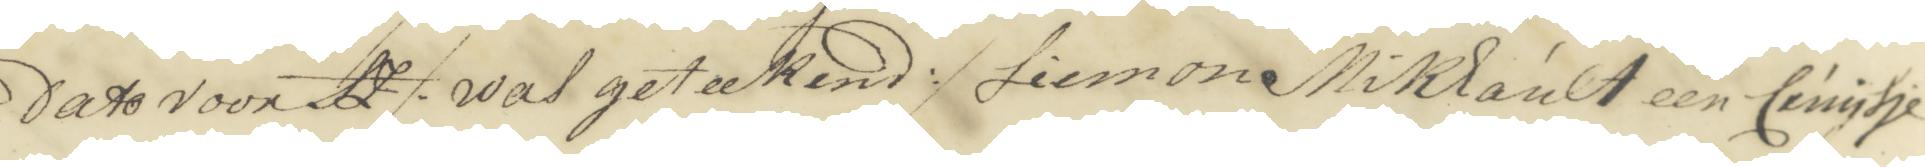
dato voorsz /. was geteekend :/ Siemon Mikhault een Cruijsje
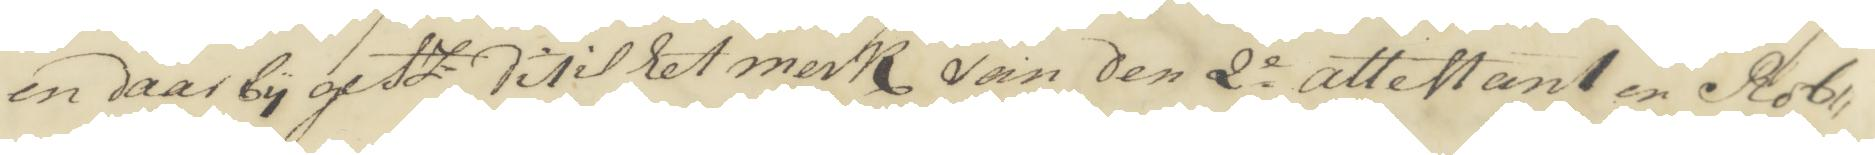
en daar bij gesz ditis het merk van den 2=e attestant en Rob„
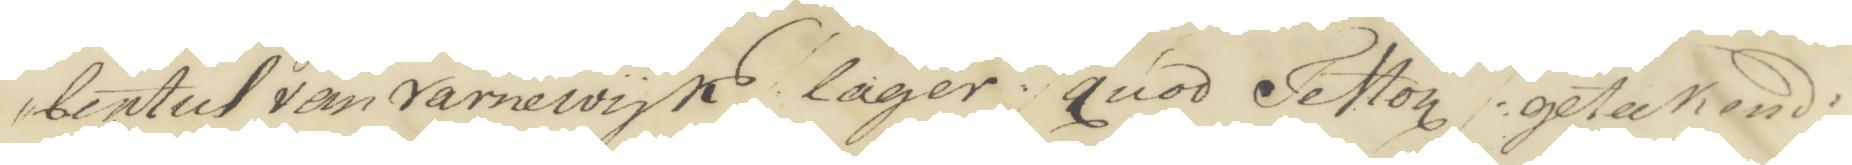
„bertus van varnewijk / lager ./ quod Testor /: geteekend /
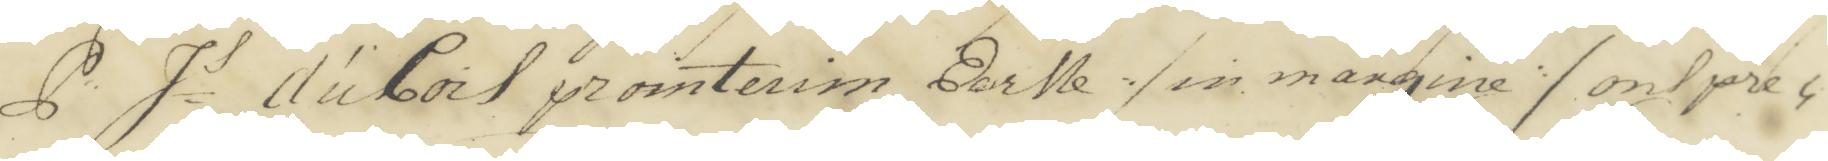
P: J=s dubois prointerim Eerste :/ in margine :/ ons pre„
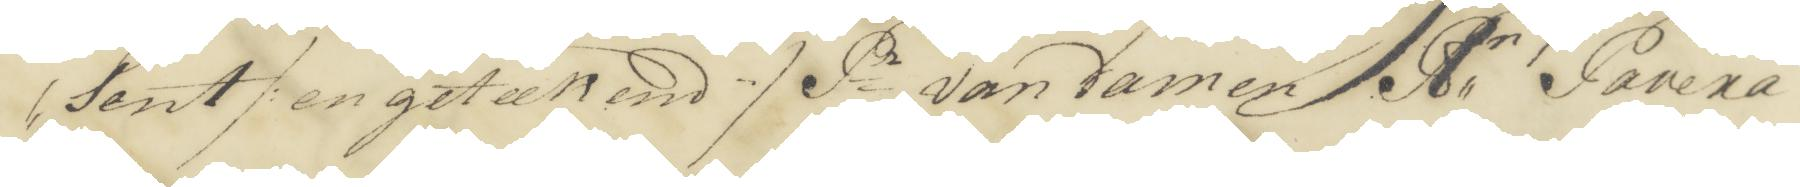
„sent /: en geteekend:/ P=r van dam en A„r Parera
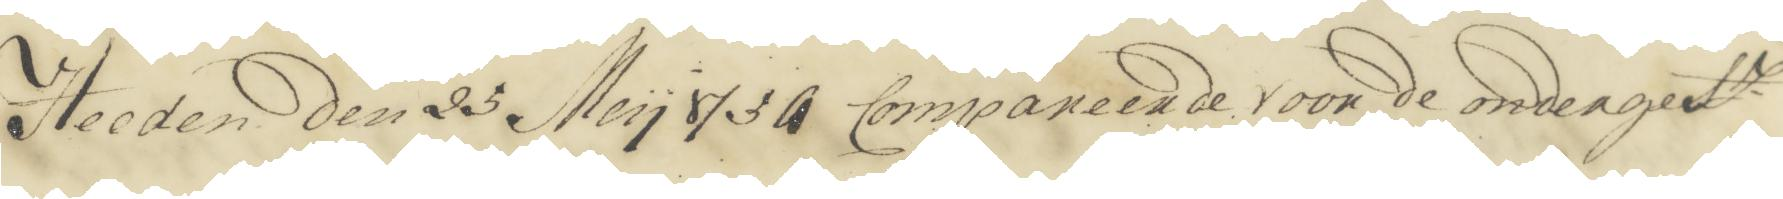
Heeden den 25 Meij 1754 Compareerde voor de ondergesz
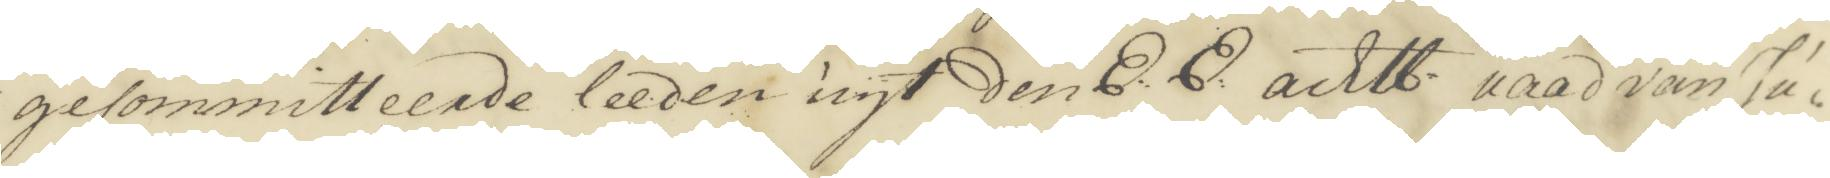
gecommitteerde leeden uijt den E: E: achtb: raad van Ju„
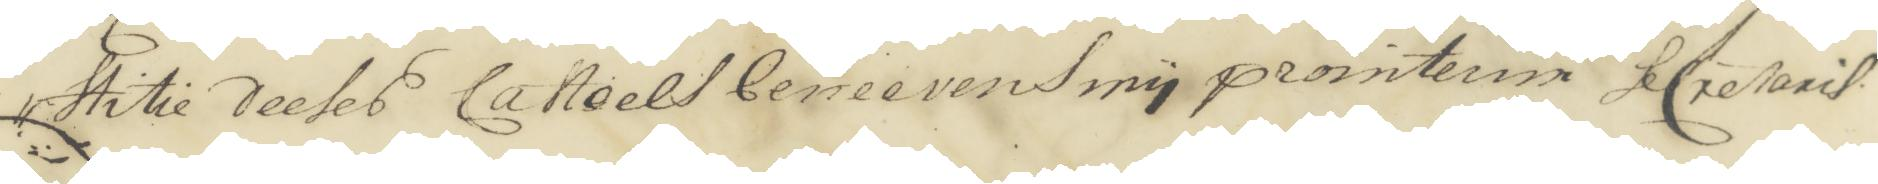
„stitie deeses Casteels beneevens mij prointerim secretaris.
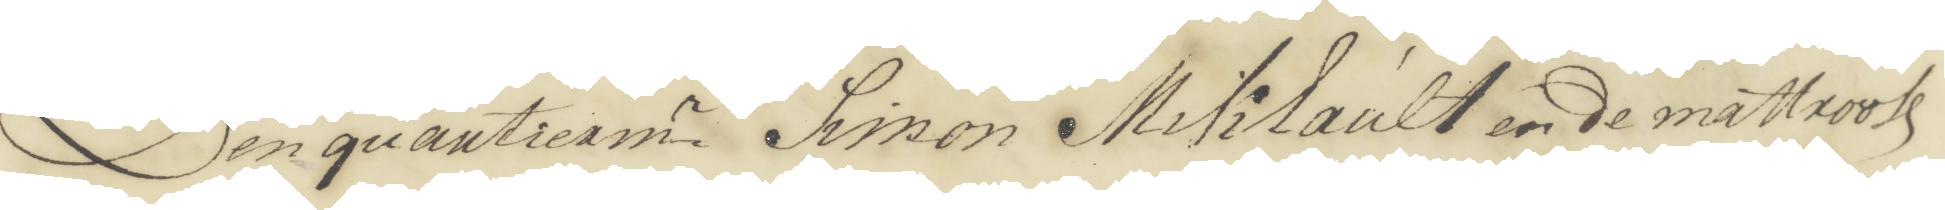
Den quartierm=r Simon Mikhault en de mattroosen
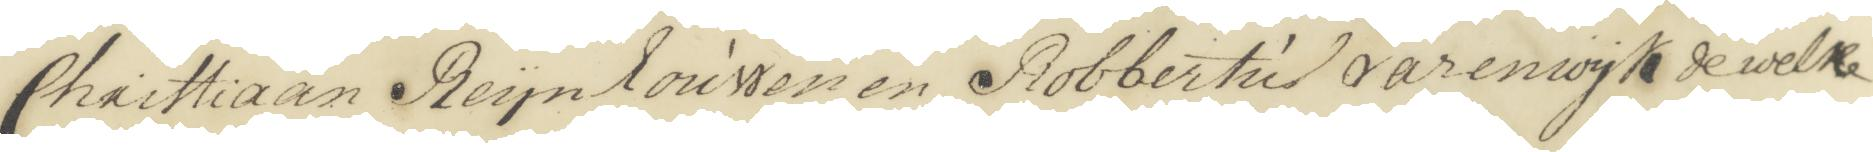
Christiaan Reijnhouwer en Robbertus varenwijk de welke
